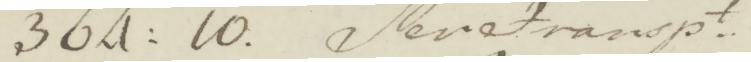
364:10. Per Transp.t.
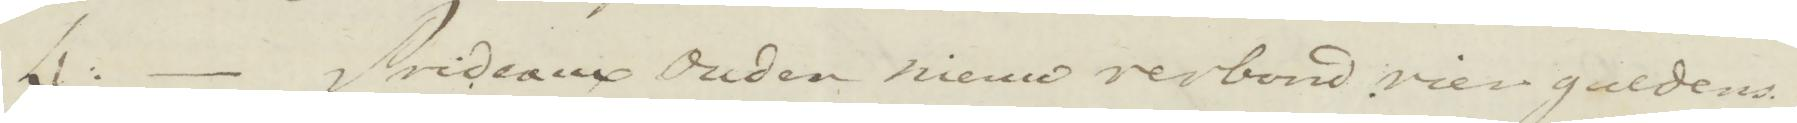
4: — Prideaux oud en nieuw verbond vier guldens.
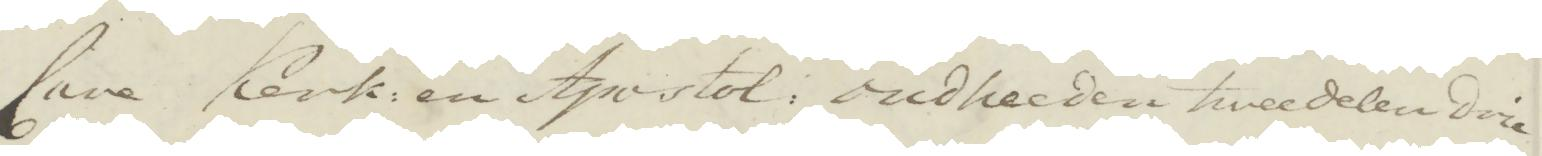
Cave Kerk: en Apostol: oudheeden twee delen drie
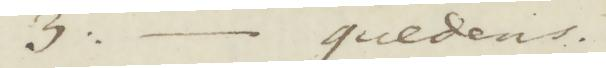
3: — guldens.
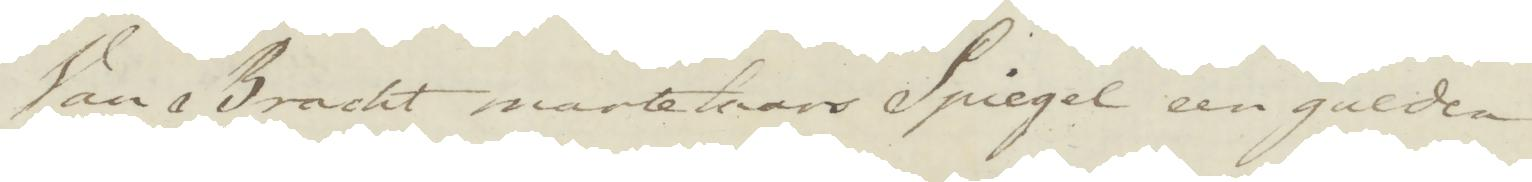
Van Bracht martelaars Spiegel een gulden
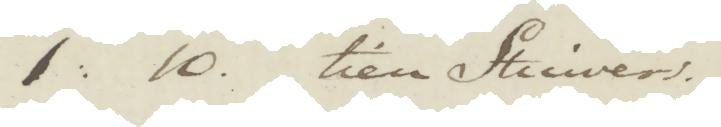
1: 10. tien Stuivers.
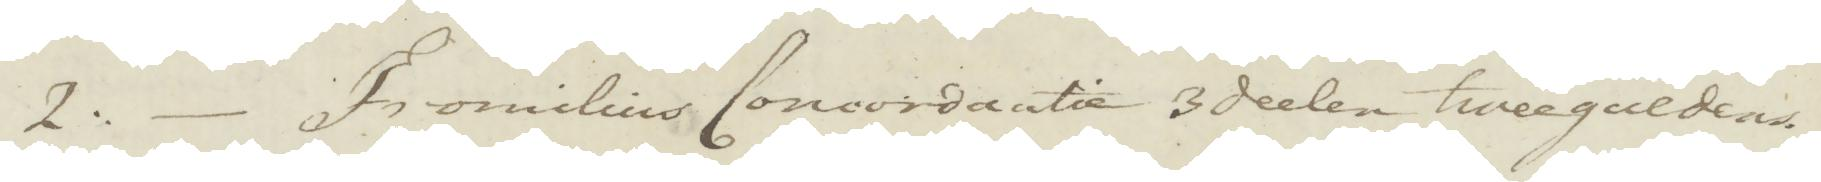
2: — Fromilius Concordantie 3 deelen twee gulden.
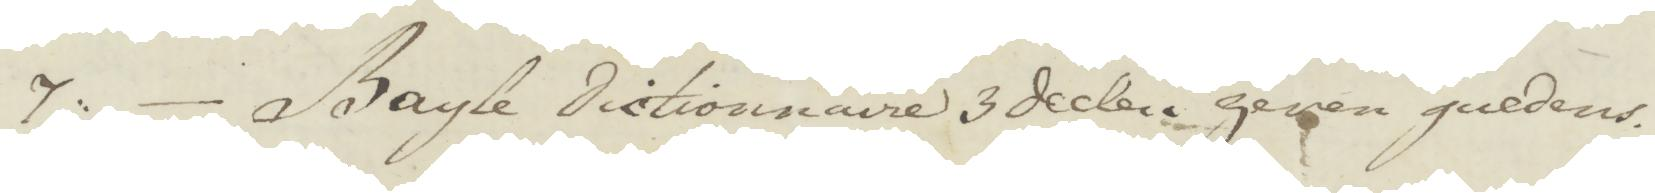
7: — Bayle dictionnaire 3 deelen zeven guldens.
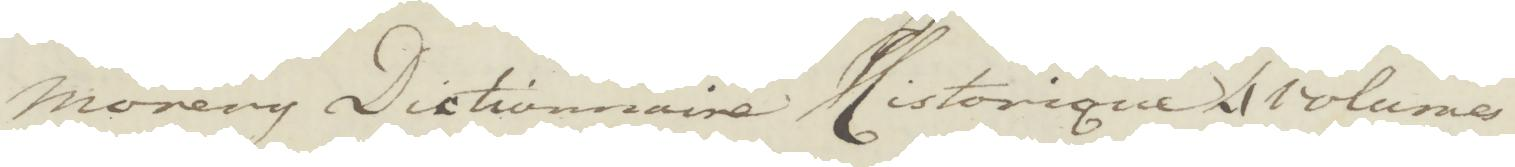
Morery Dictionnaire Historique 4 volumes
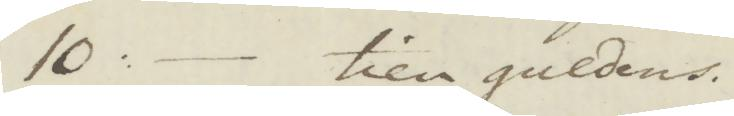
10: — tien guldens.
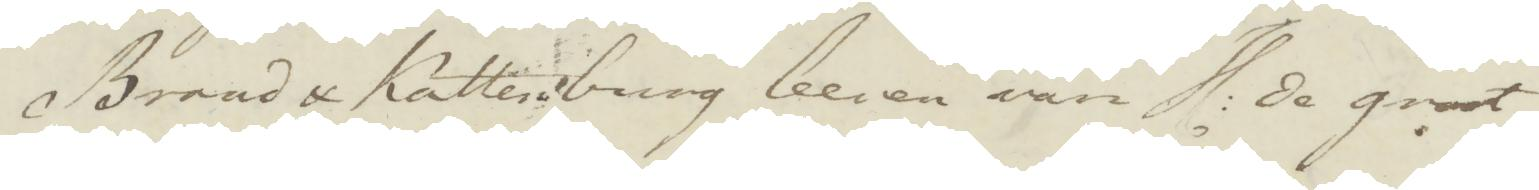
Brand & Kattenburg leeven van H: de groot
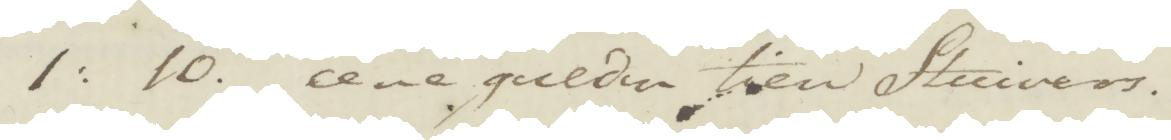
1: 10. eene gulden tien Stuivers.
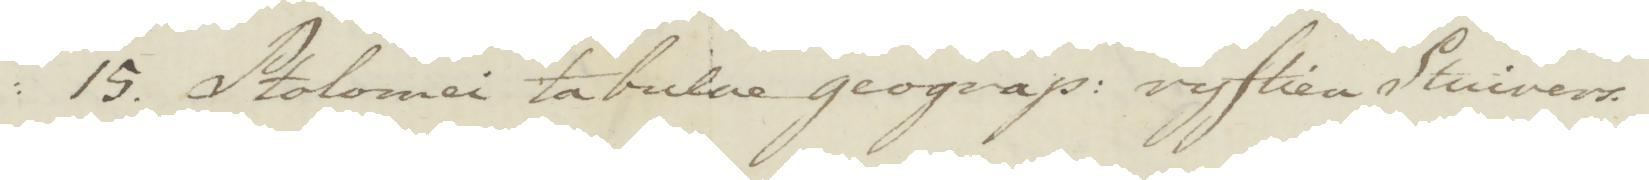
:15. Ptolomei tabulae geograp: vijftien Stuivers
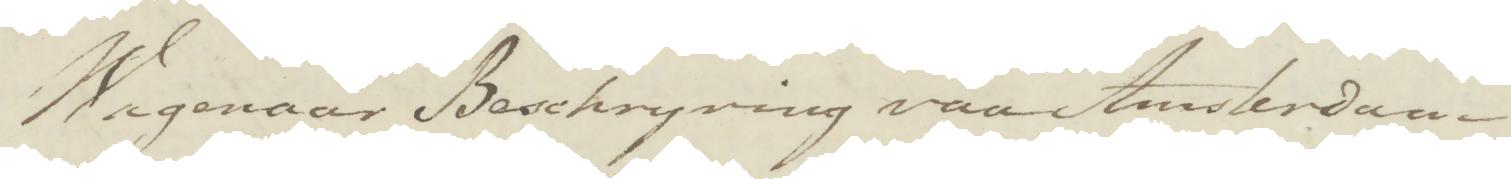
Wagenaar Beschrijving van Amsterdam
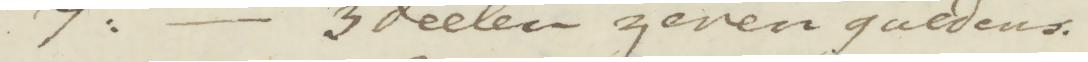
7 : — 3 deelen zeven guldens.
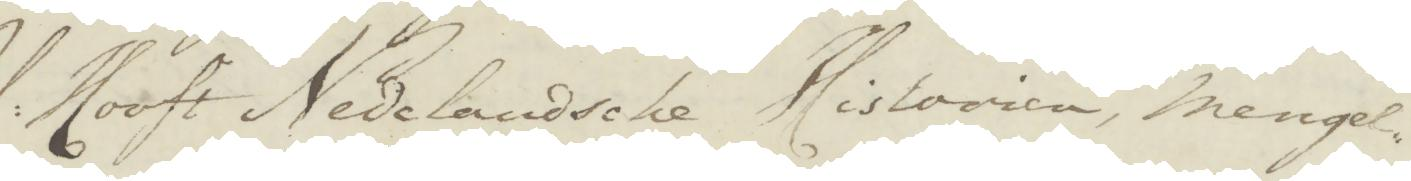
Hooft Nedelandsche Historien, mengel„
